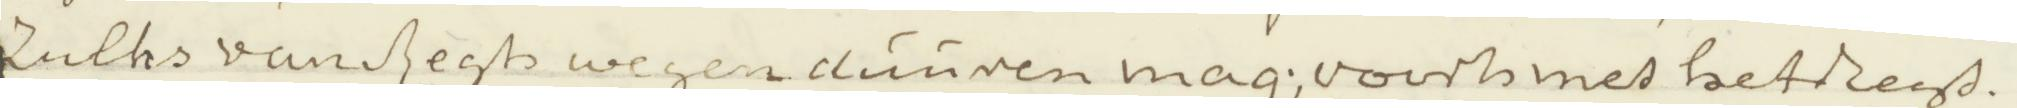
zulks van Regts wegen duuren mag; voorts met het regt.
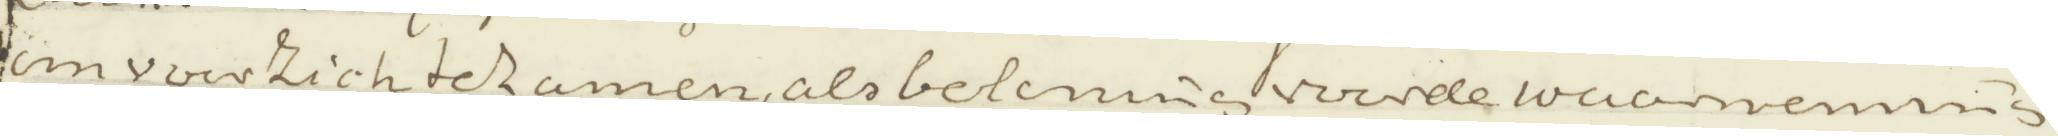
om voor zich tezamen, als beloning voorde waarneming
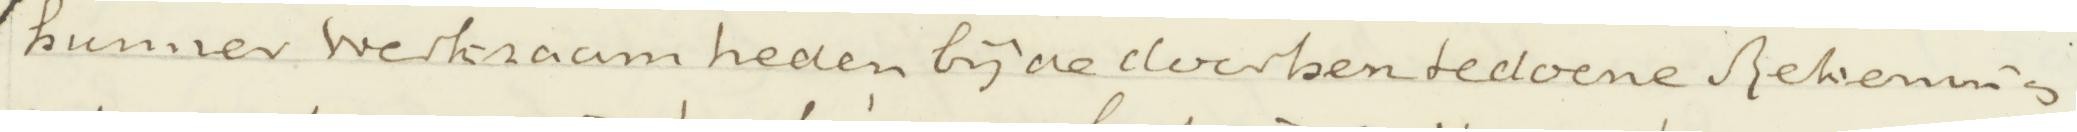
hunner werkzaam heden bij de door hen te doene Rekening
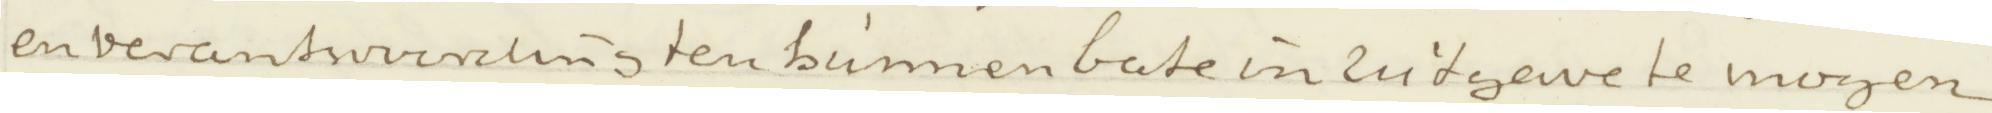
en verantwoording ten hunnen bate in uitgave te mogen
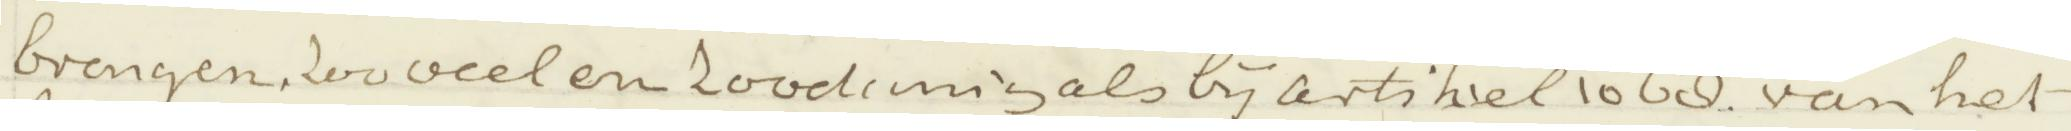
brengen, zoo veel en zoodanig als bij artikel 1068. van het
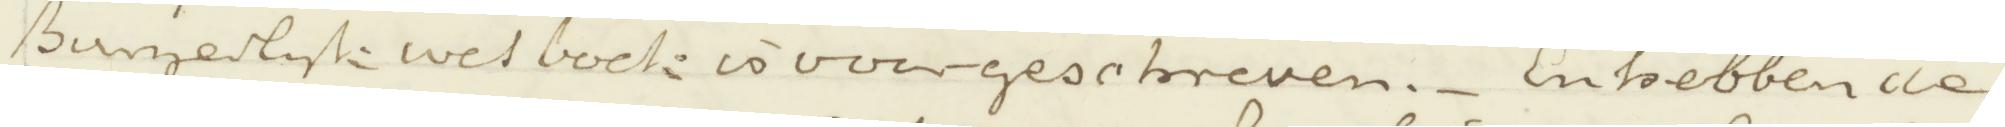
Burgerlyk wet boek is voorgeschreven. – En hebben de
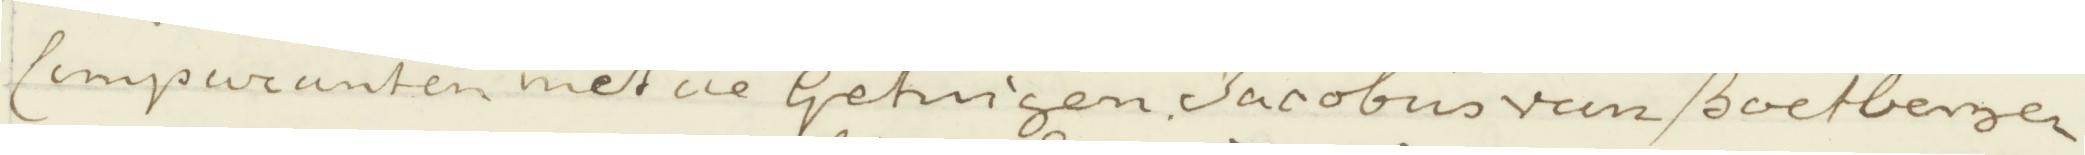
Comparanten met de Getuigen. Iacobus van Boetbergen
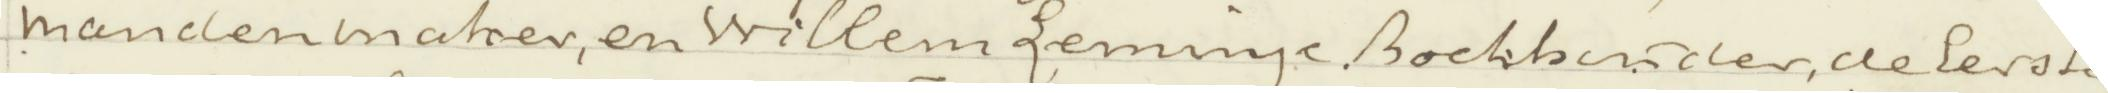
mandenmaker, en Willem Leminge Boekhouder, de Eerste
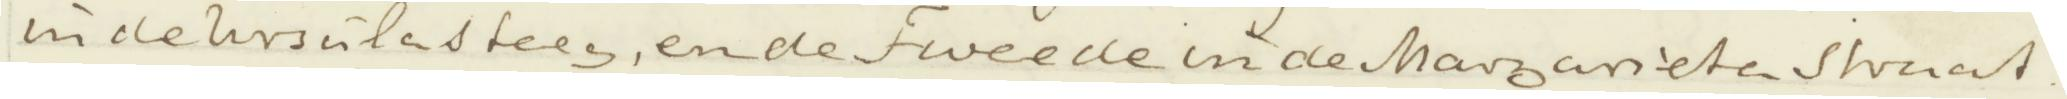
in de ursulasteeg, en de Tweede in de Margarieta straat
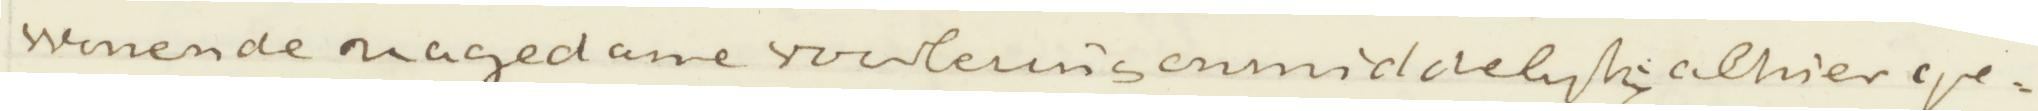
wonende nagedane voorlezing onmiddelyk alhier ge=
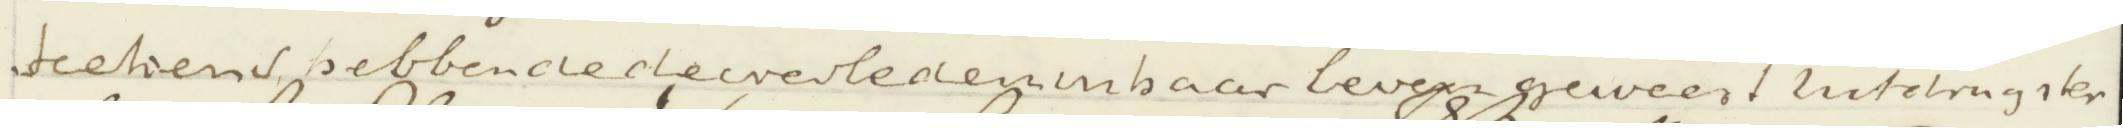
„teekend hebbende de overleden in haar leven geweest uitdragster
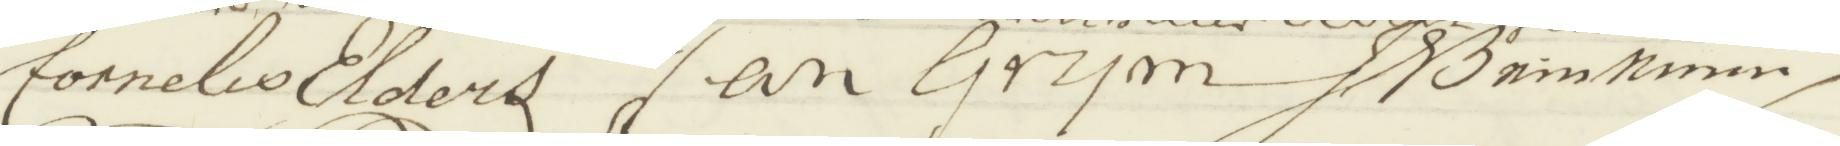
Cornelis Elders Jan Grym J Brinkman
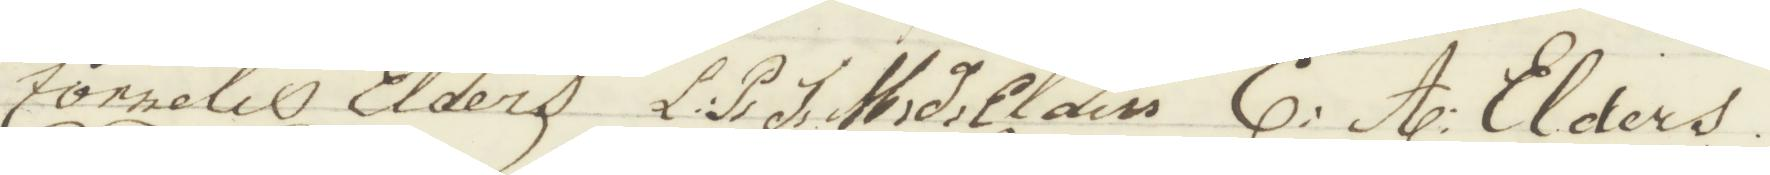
Cornelis Elders L:P:S:M:J: Elders C: A: Elders.
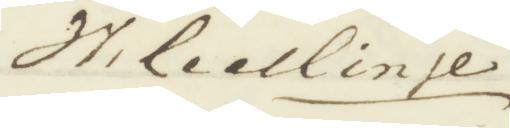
W. leminge
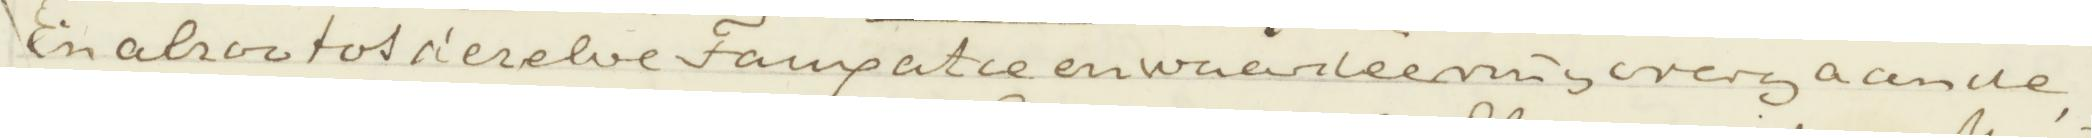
En alzoo tot dezelve Tauxatie en waardeering overgaande,
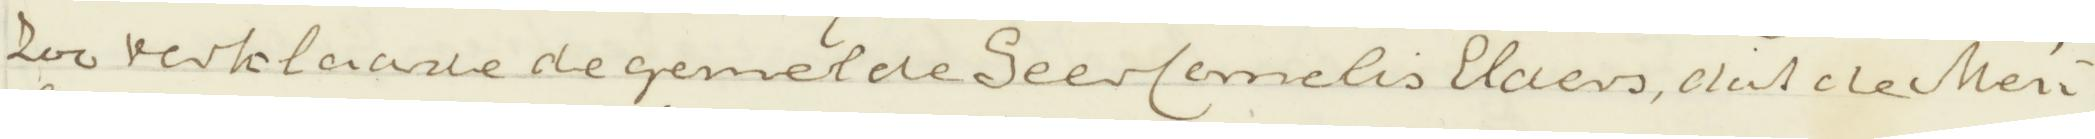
zoo verklaarde de gemelde heer Cornelis Elders, dat de Meu
